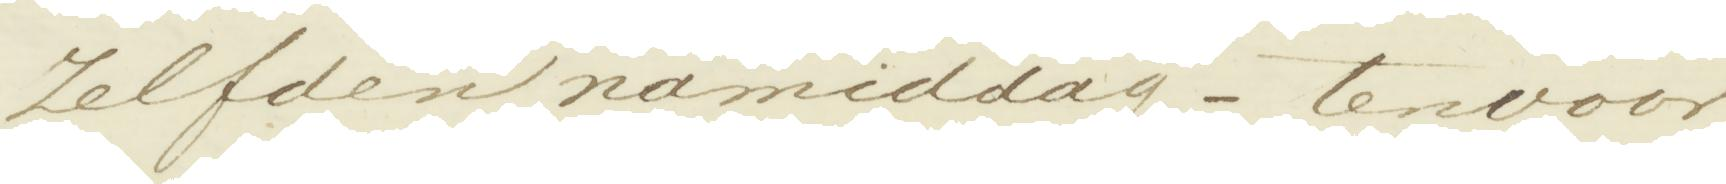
zelfden namiddag - ten voor
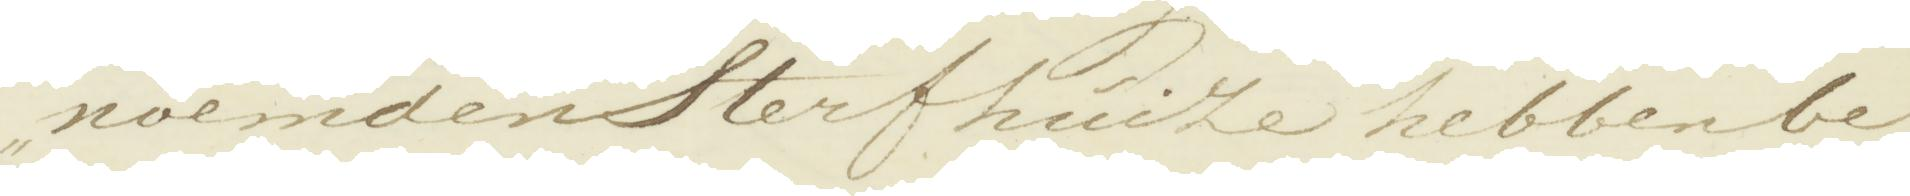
„noemden sterfhuize hebben be
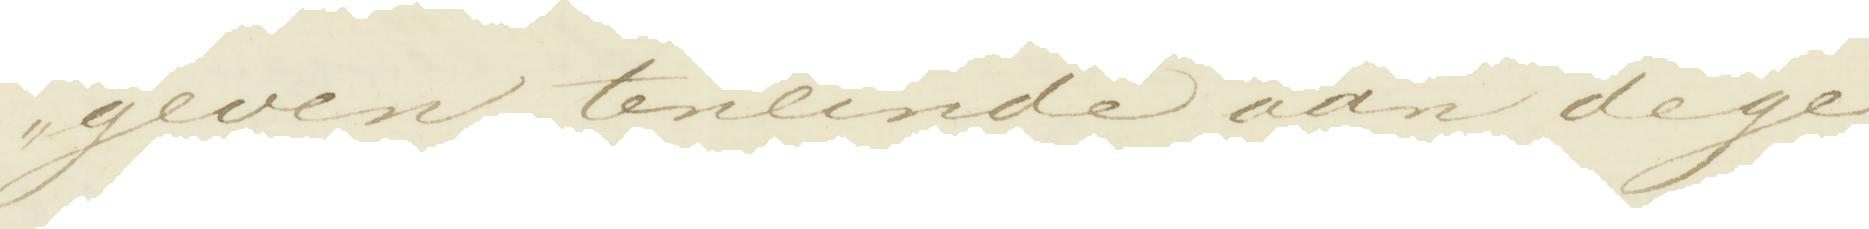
„geven, ten einde aan de ge
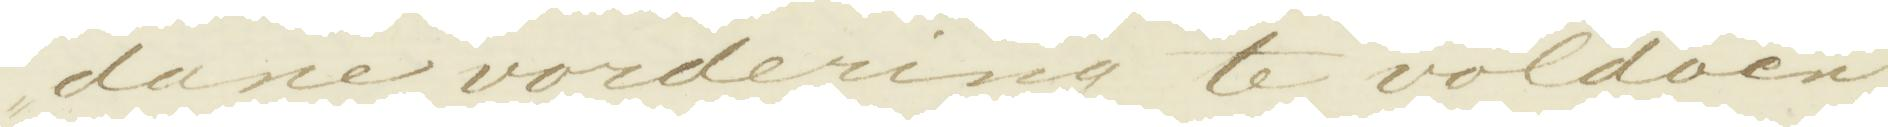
„dane vordering te voldoen
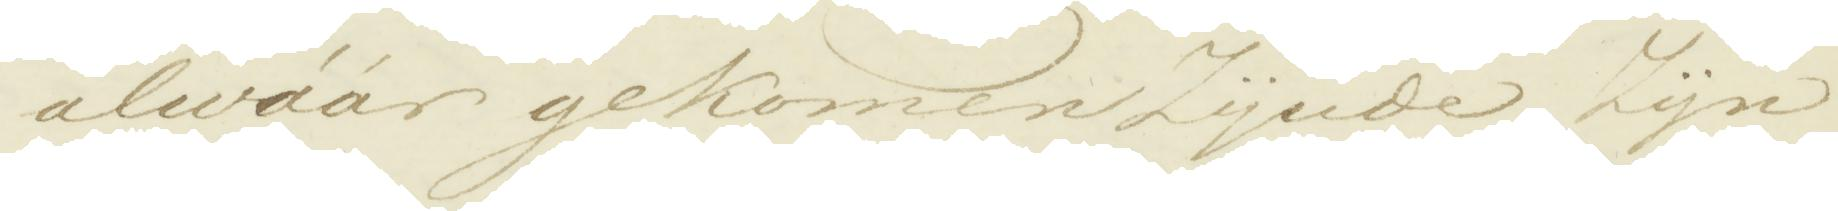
alwáár gekomen zijnde, zijn
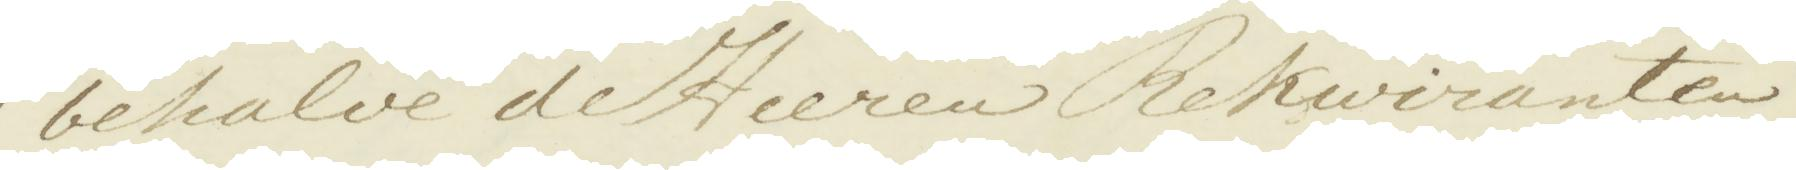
behalve de Heeren Rekwiranten
